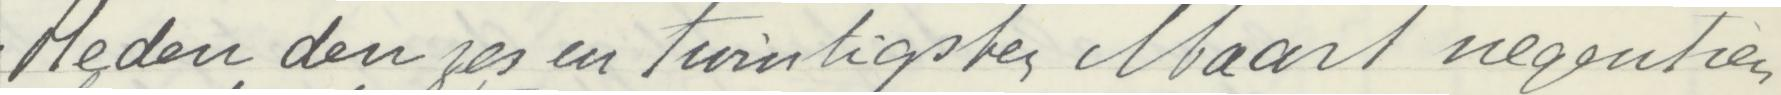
Heden den zes en twintigsten Maart negentien
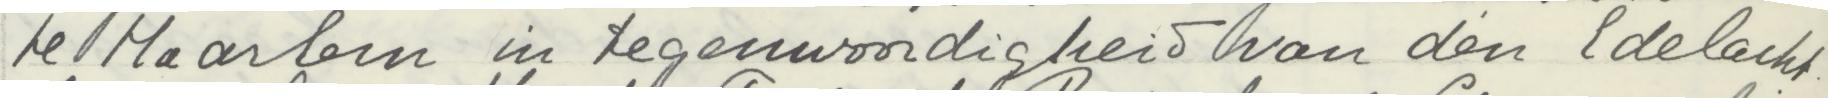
te Haarlem in tegenwoordigheid van den Edelacht
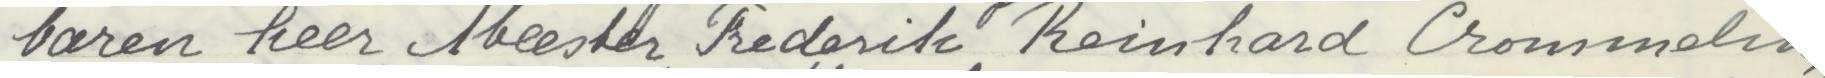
baren heer Meester Federik Reinhard Crommelin,
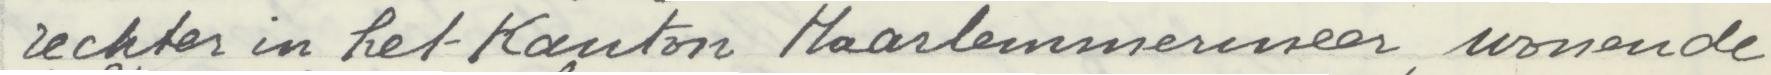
rechter in het kanton Haarlemmermeer, wonende
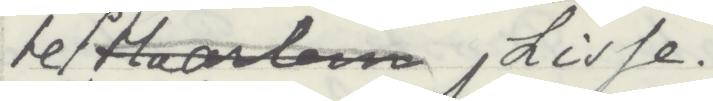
te Haarlem Lisse.
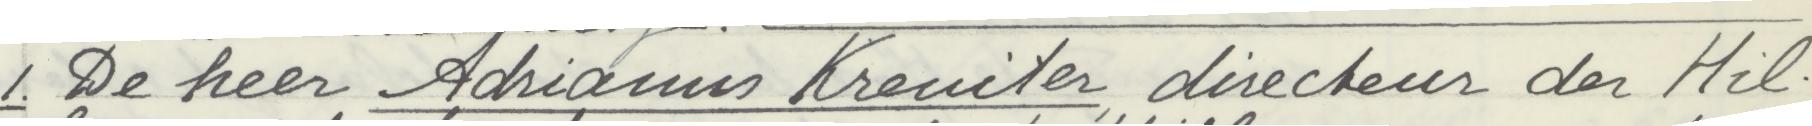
1. De heer Adrianus Kreuiter, directeur der Hil
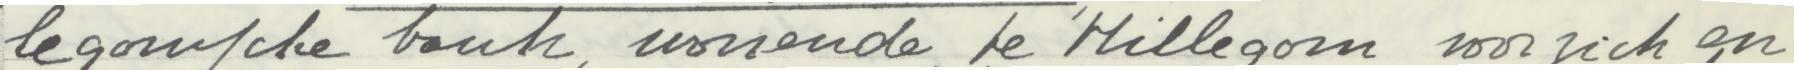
legomsche bank, wonende te Hillegom, voor zich en
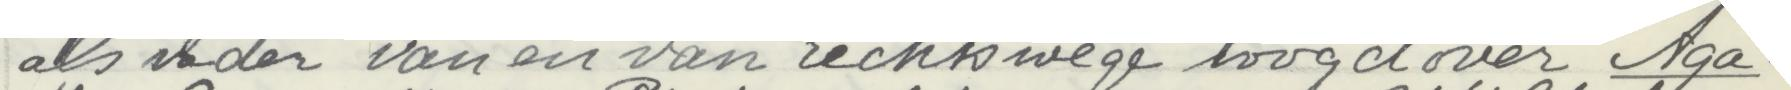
als vader van en van rechtswege voogd over Aga-
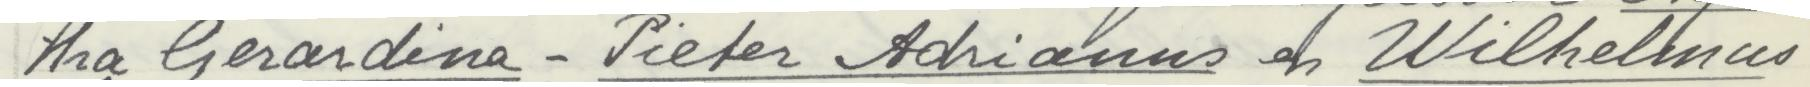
tha Gerardina - Pieter Adrianus en Wilhelmus
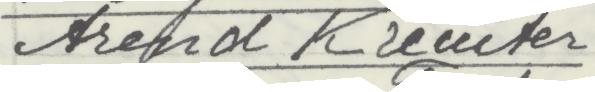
Arend Kreuiter
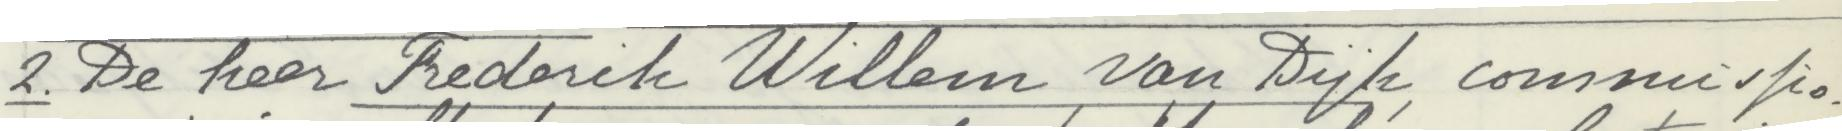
2. De heer Federik Willem van Dijk commissio
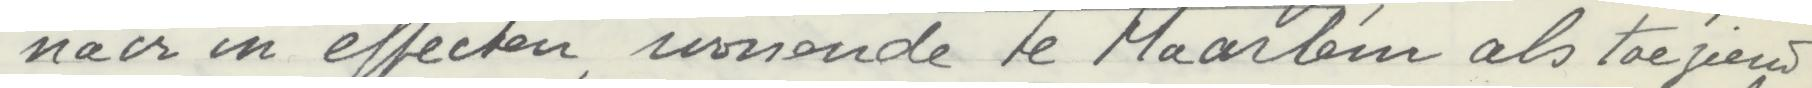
nair in effecten, wonende te Haarlem als toeziend
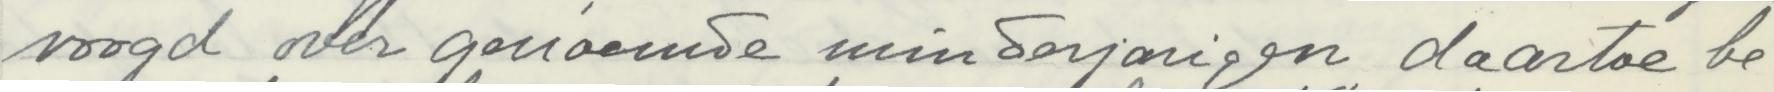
voogd over genoemde minderjarigen daartoe be
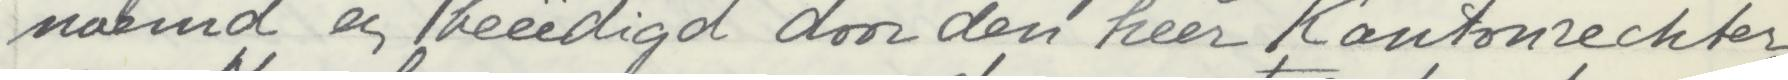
noemd en beëedigd door den heer Kantorechter
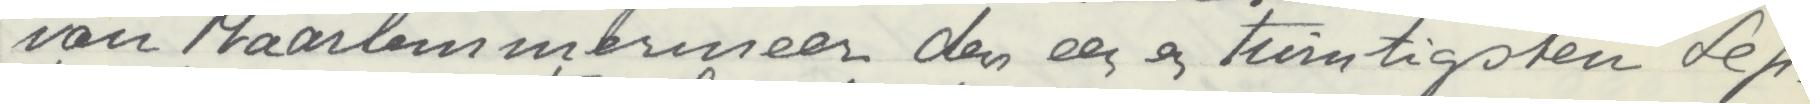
van Haarlemmermeer den een en twintigsten Sep
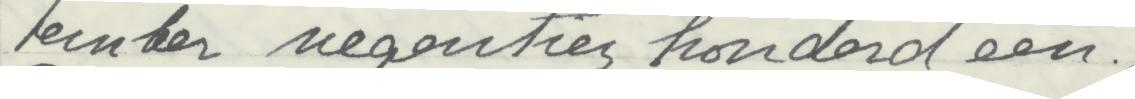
tember negentien honderd een.
